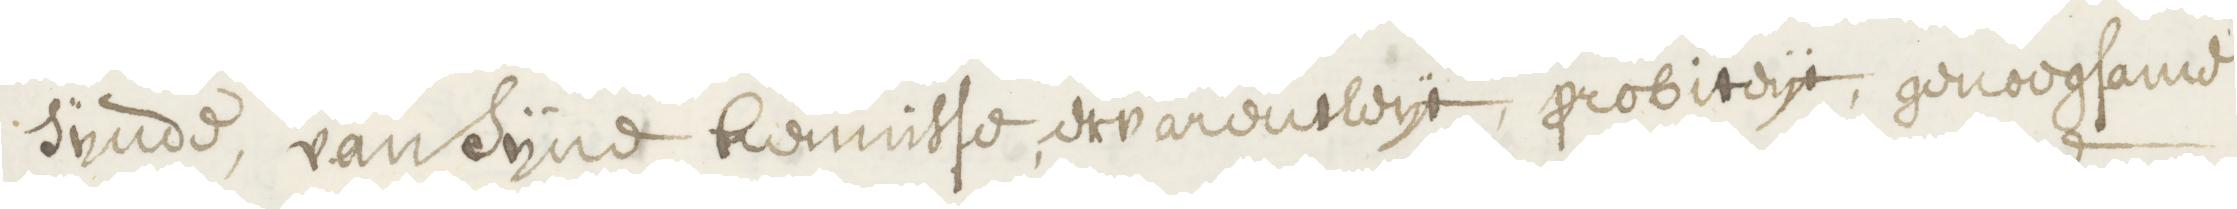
sijnde, van Sijne kennisse, ervarentheijt, probiteijt, genoegsame
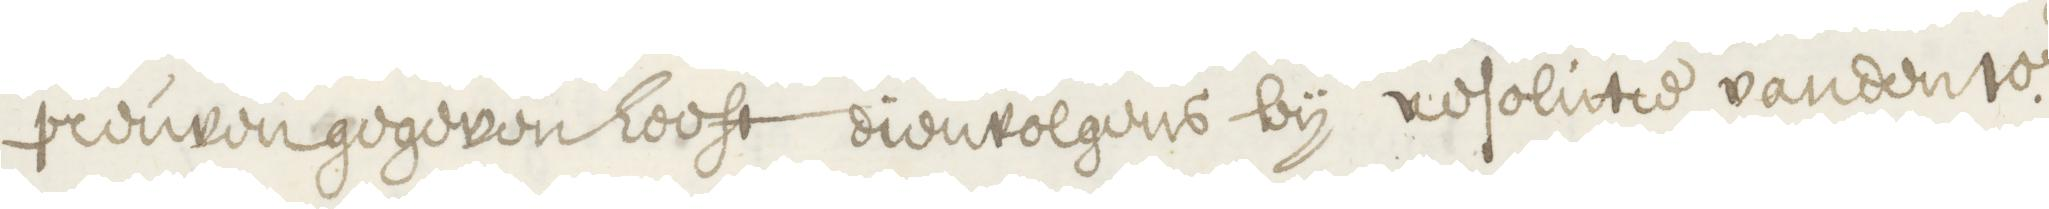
preuven gegeven heeft dienvolgens bij resolutie van den 10.e
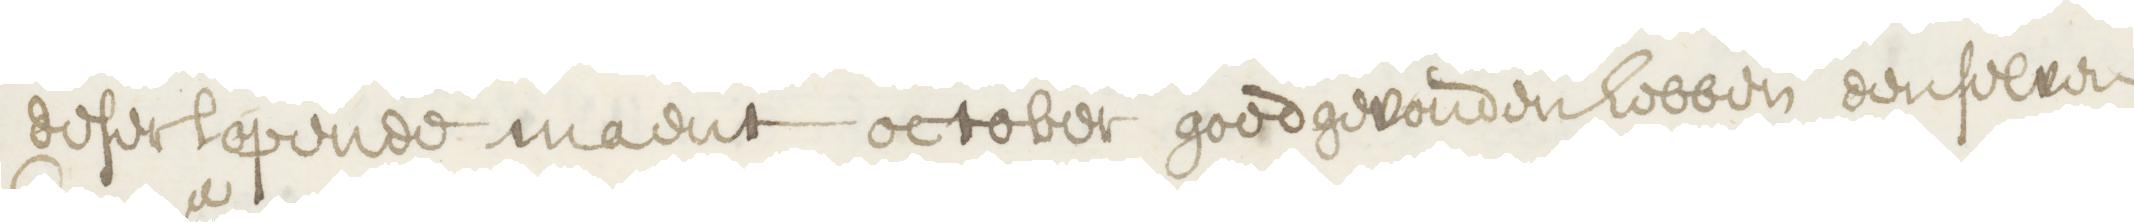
deser lopende maent october goed gevonden hebben denselven
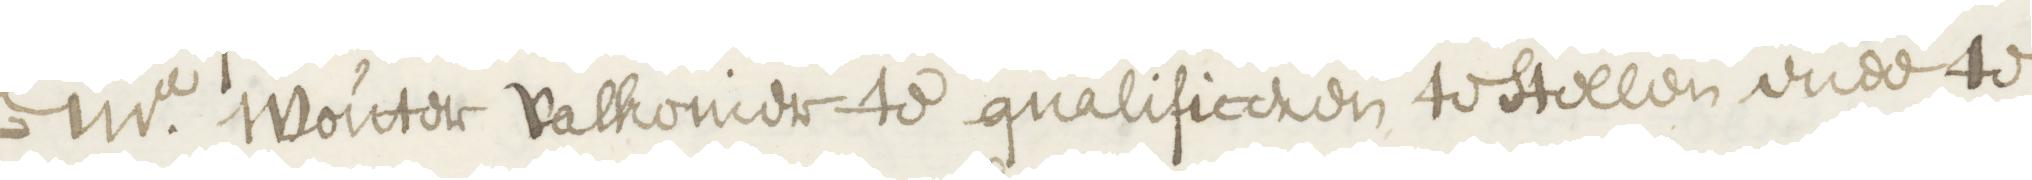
E m.r Wouter Valkonier te qualificeren te stellen ende te
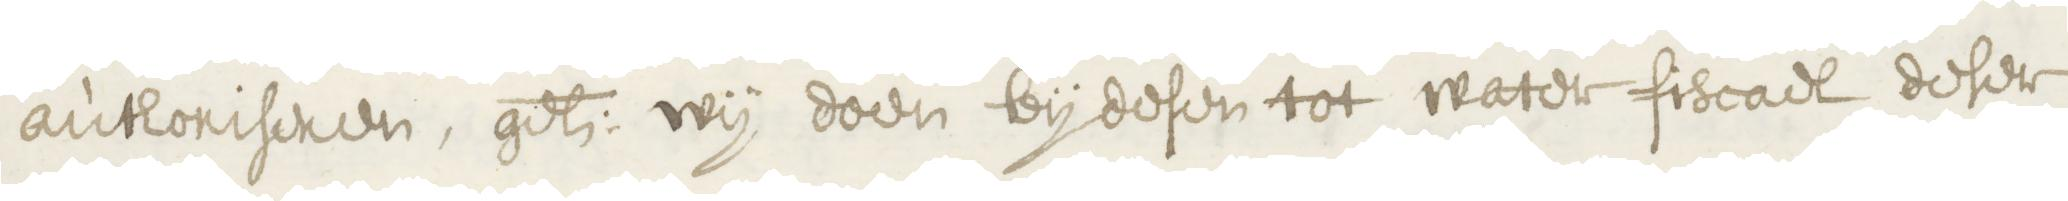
authoriseren, gelijk wij doen bij desen tot water fiscael deser
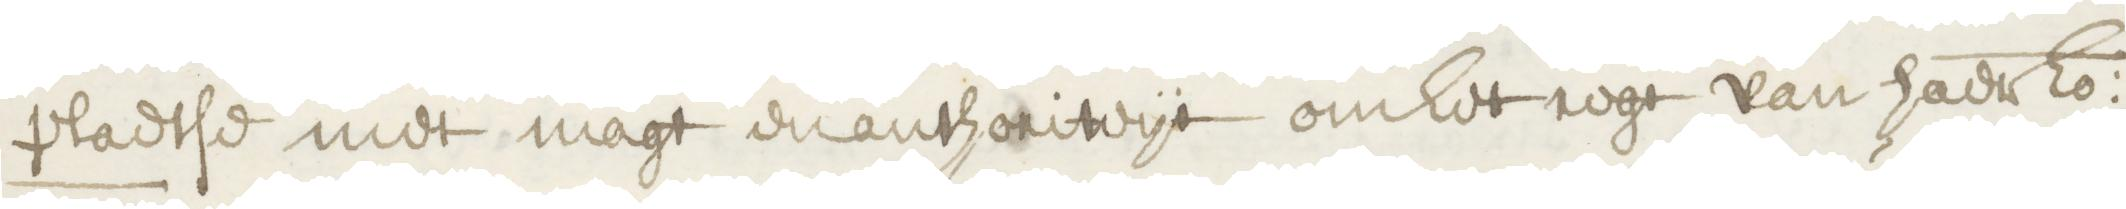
plaetse met magt en authoriteijt om het regt van haer ho:
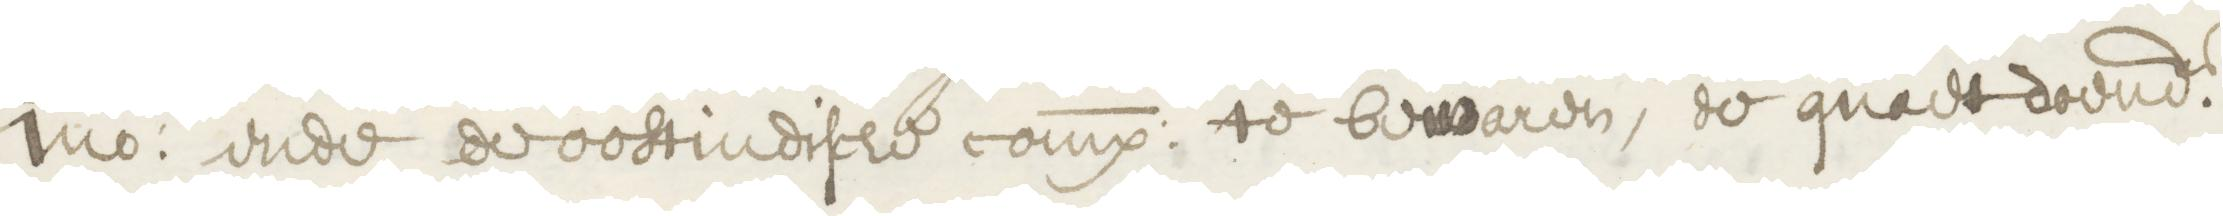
mo: ende de oostindiche comp: te bewaren, de quaetdoend.s
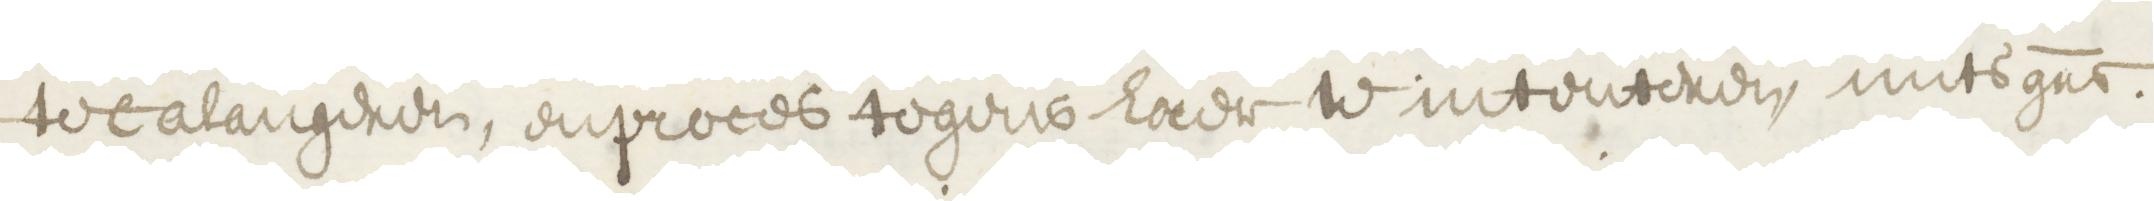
te calangeren, en proces tegens haer te intenteren, mitsgrs.
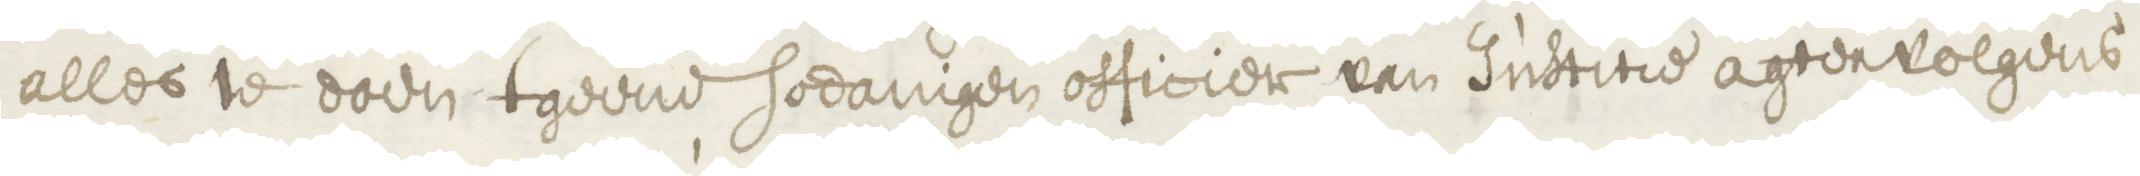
alles te doen t geene sodanigen officier van Iustitie agtervolgens
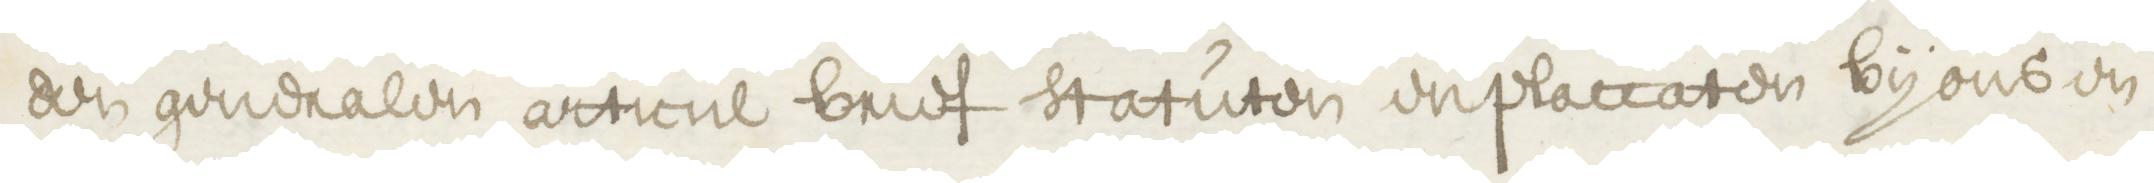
den generalen articul brief statuten en placcaten bij ons en
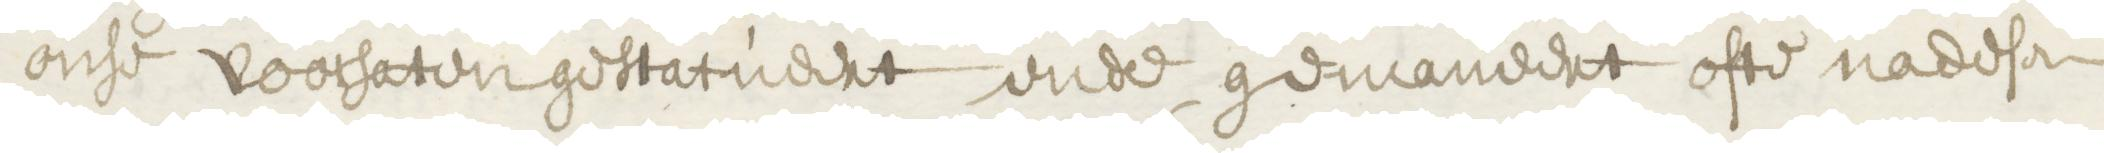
onse voorsaten gestatueert ende g' emaneert ofte na desen
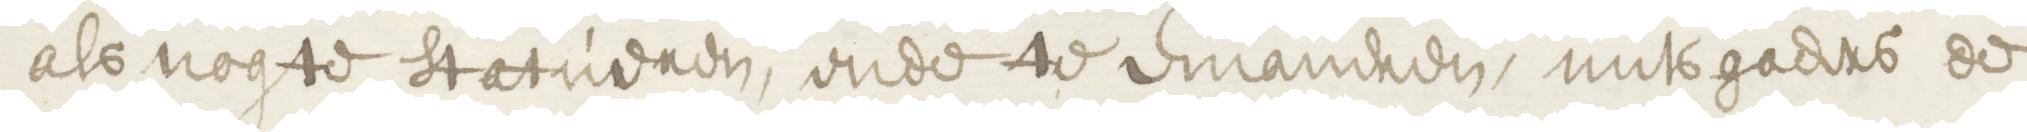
als nogte statueren, ende te emaneren, mitsgaders de
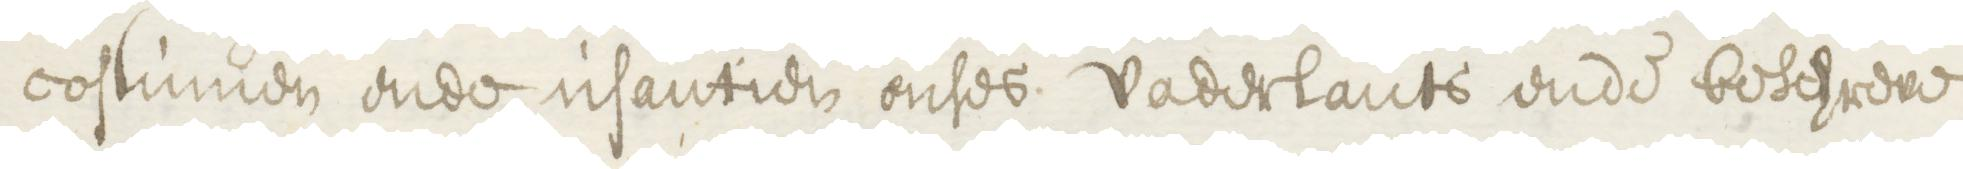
costumen ende usantien onses vaderlants ende beschreve
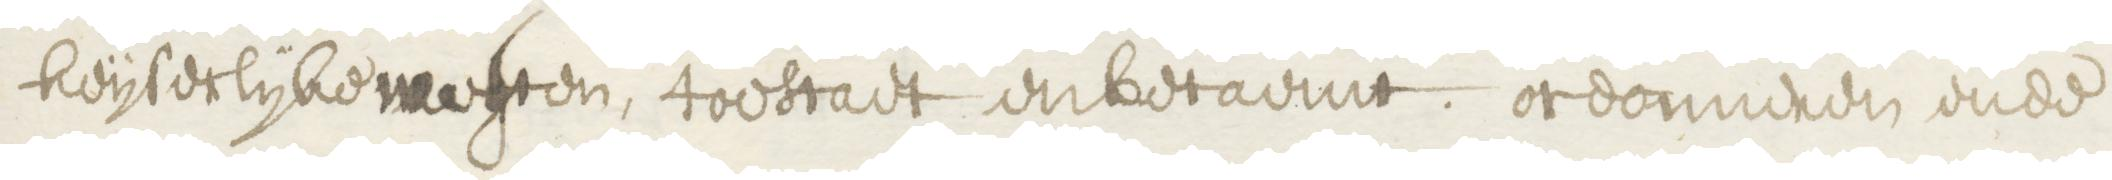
keijserlijke wetten, toestaet en betaemt. ordonneren ende
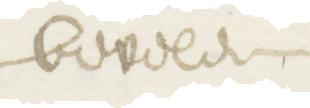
bevelen.
